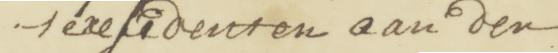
se residenten aan der
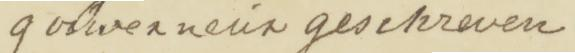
gouverneur geschreven
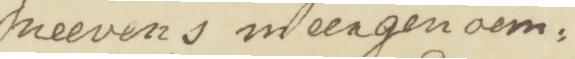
neevens meergenoem„
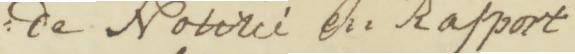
de Notitie en Rapport
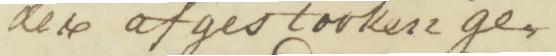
der afgestooken ge
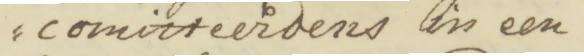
„comitteerdens in een
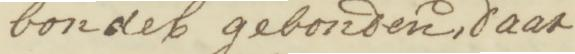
bondel gebonden, daar
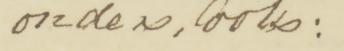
onder, ook:
